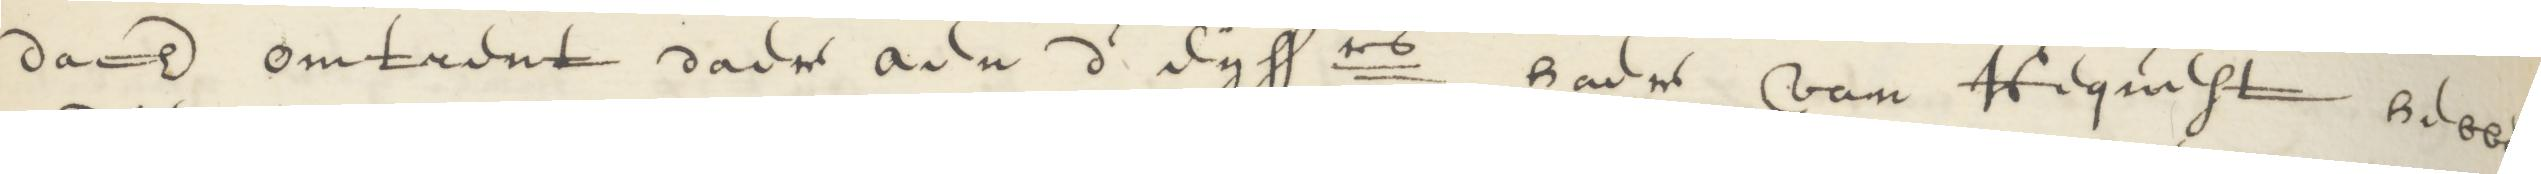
dach omtrent daer aen d’ eijss=rs haer van Request hebben
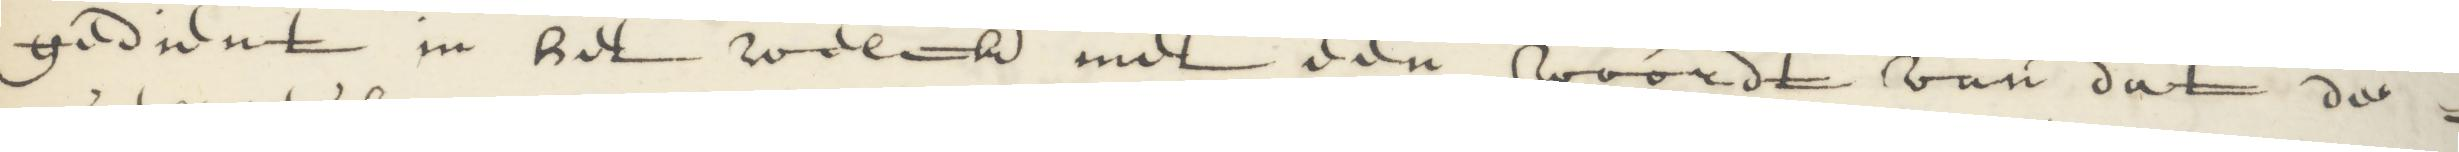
gedient in het welck met een woordt van dat de
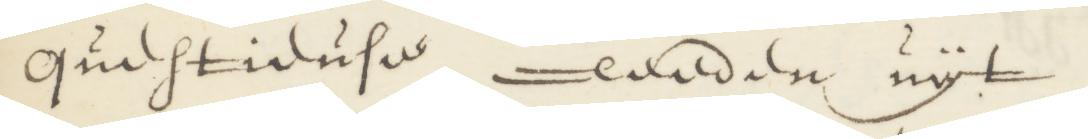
questieuse cleeden uijt
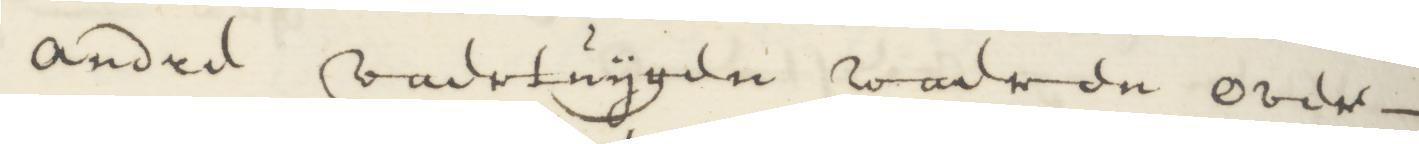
andre vaertuijgen waeren over—
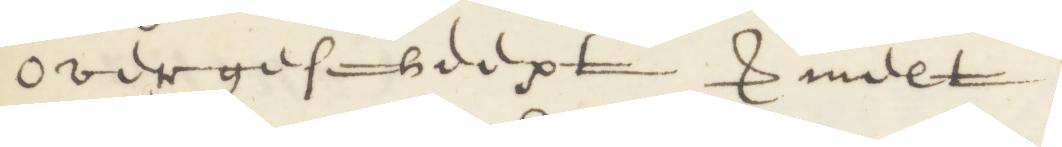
overgescheept vermelt
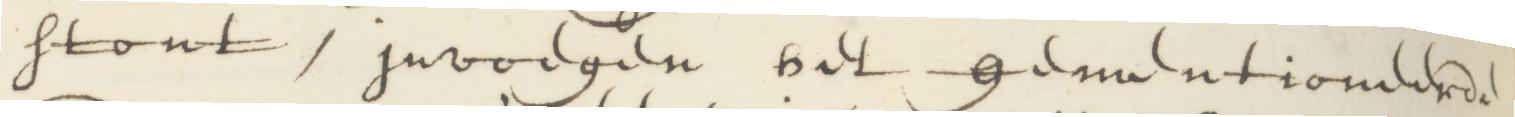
stont, jnvoegen het gementioneerde
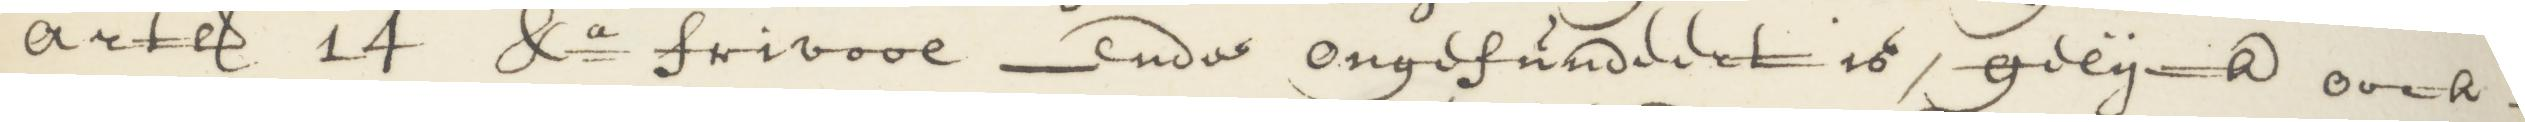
artlver 14 Et=a frivool ende ongefundeert is, gelijck oock
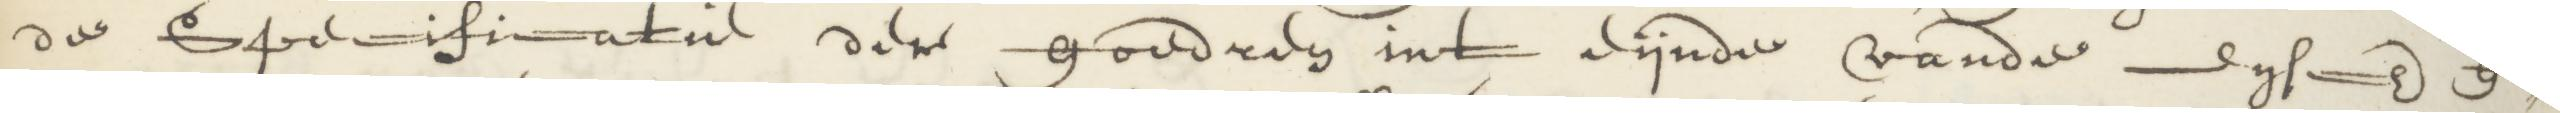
de Specificatie der goedren int eijnde vande eysch ge„
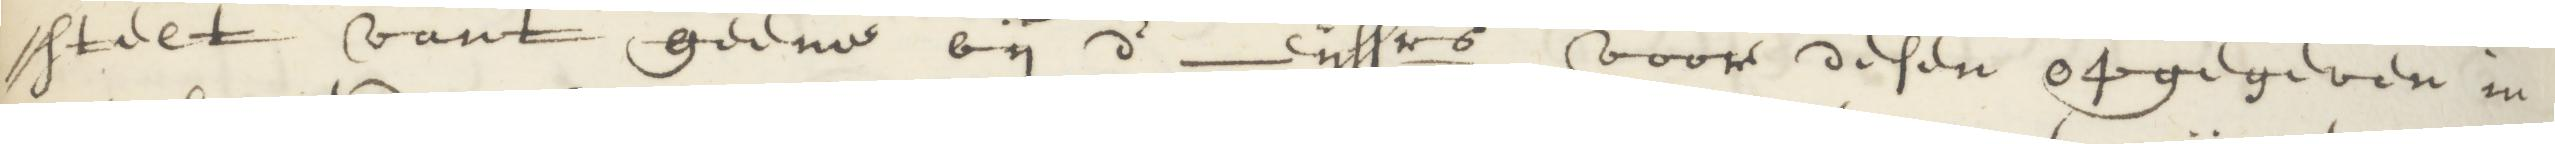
„stelt vant geene bij d’ eijss=rs voor desen opgegeven in
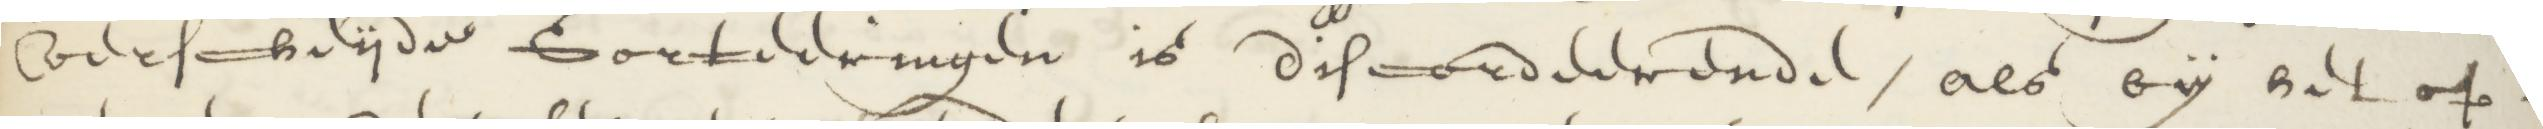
verscheijde Sorteeringen is discordeerende, als bij het op
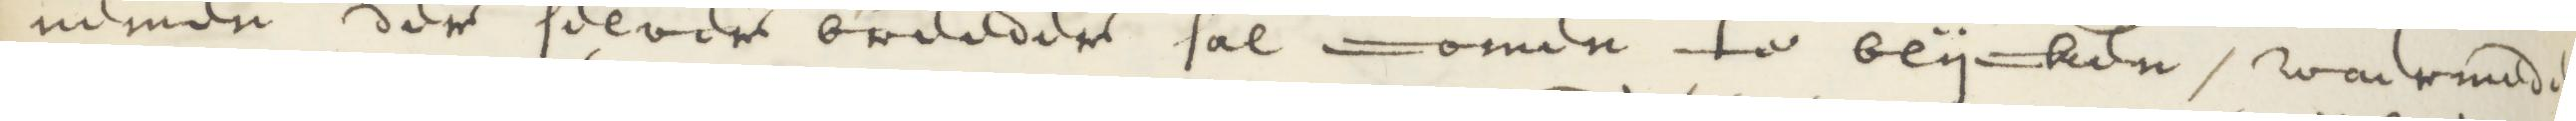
nemen der selver breeder sal comen te blijcken, waermede
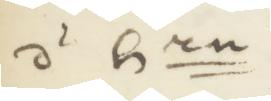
d’ h=rn
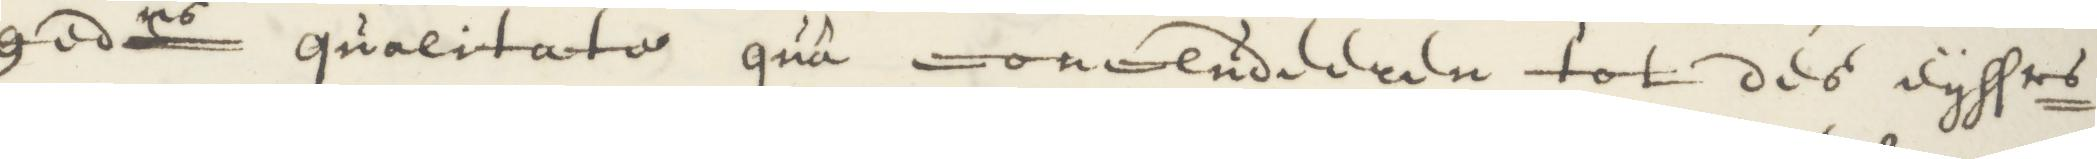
ged=ns qualitate quâ concludeeren tot des eijss=rs
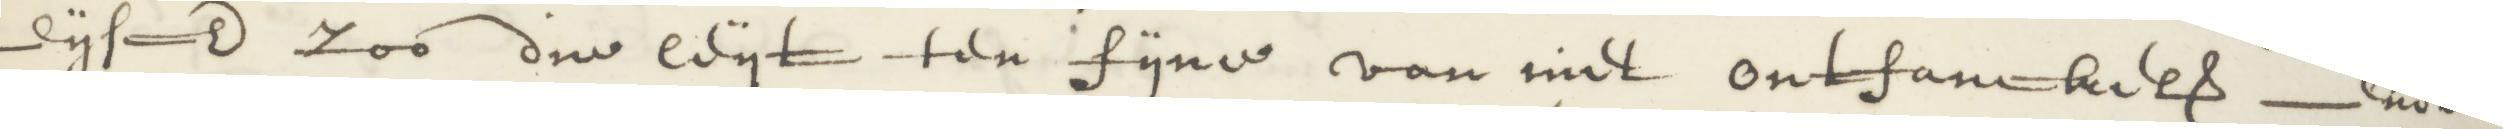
eijsch zoo die leijt ten fijne van niet ontfanckelijk ende
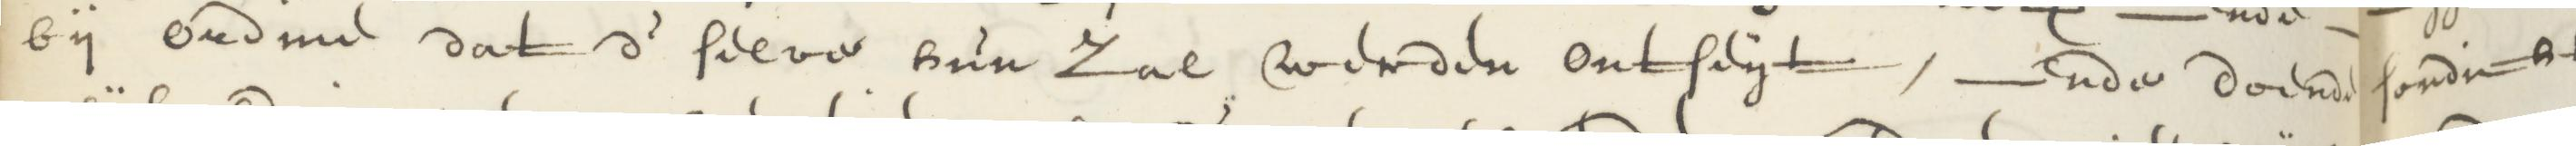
bij ordine dat d’ selve hun zal werden ontseijt, ende doende doende
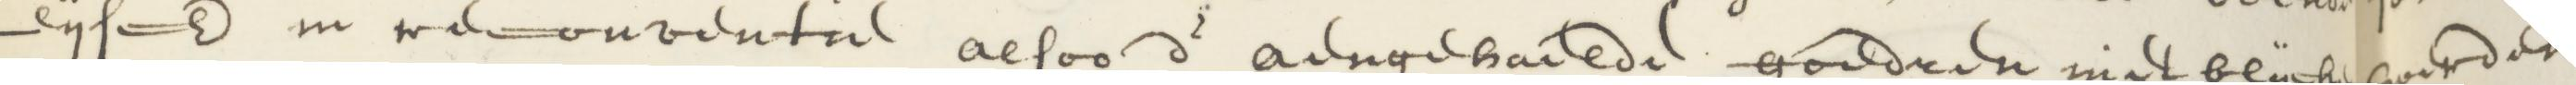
eijsch in reconventie alsoo d’ aengehaelde goedren niet blijcken
